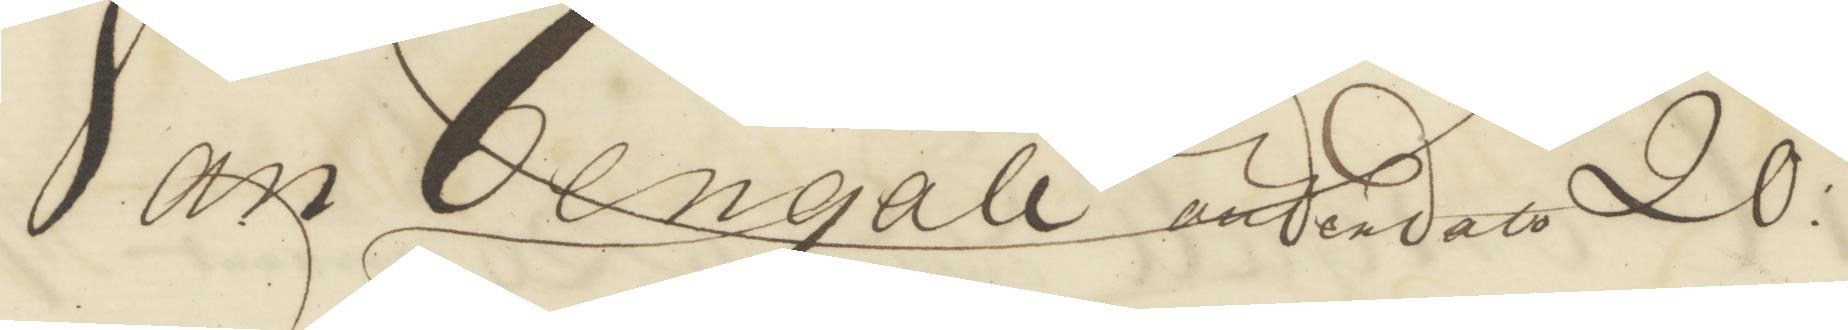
Van bengale onder dato 20:' Maart 1737.
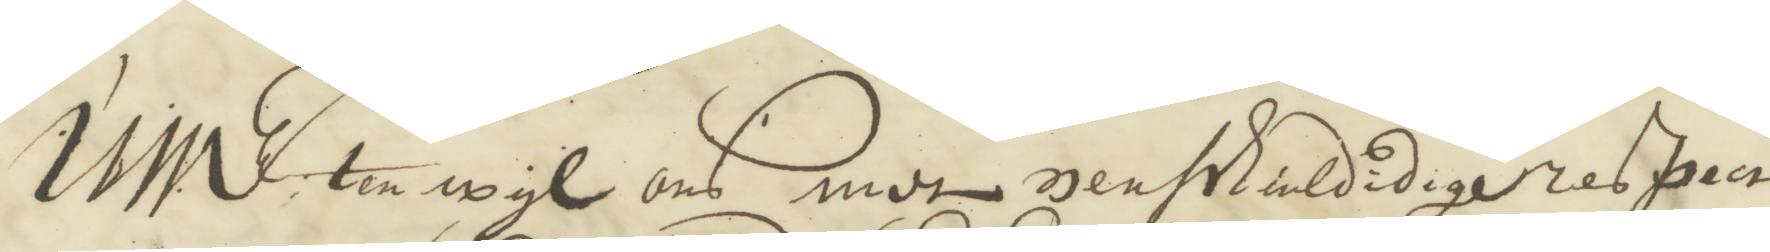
UWE: ter wijl ons met verschuldidige respect
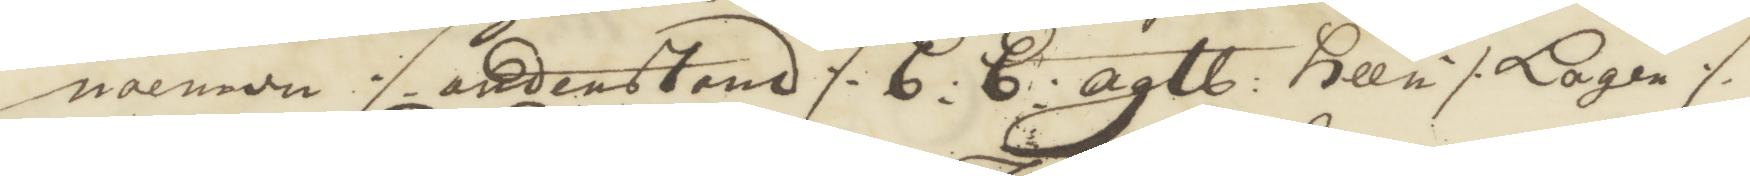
noemen ./. onderstond ./. E: E: agtb: heer ./. Lager ./.
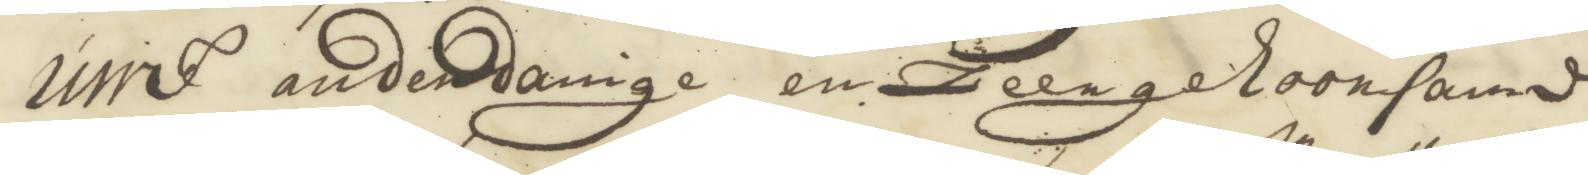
UWE onderdanige en zeer gehoorsame
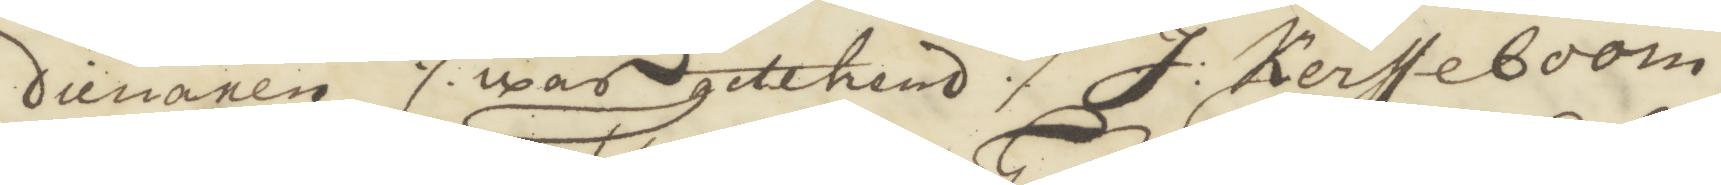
dienaren ./. was getekend ./. J: Kersseboom,
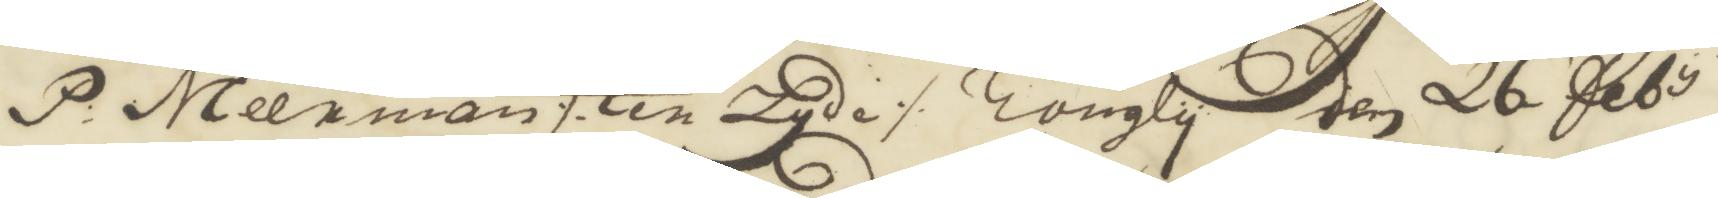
P: Meerman ./. ten zijde ./. houglij den 26. febij
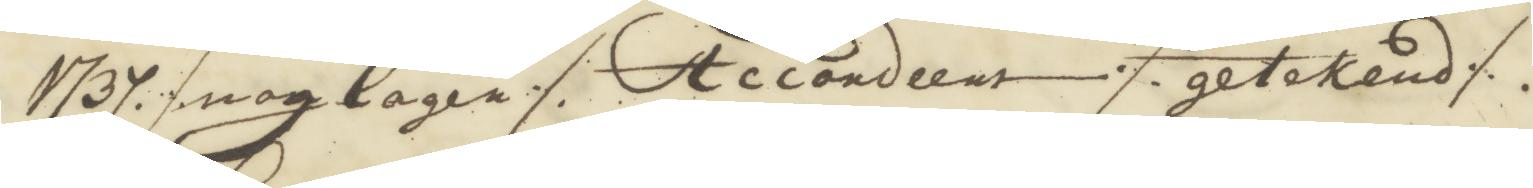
1737./. nog lager ./. Accordeert ./. getekend ./. .
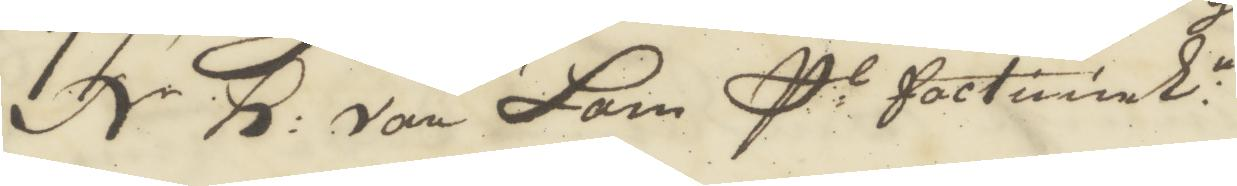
N h: van Lam P:l factuurh:r
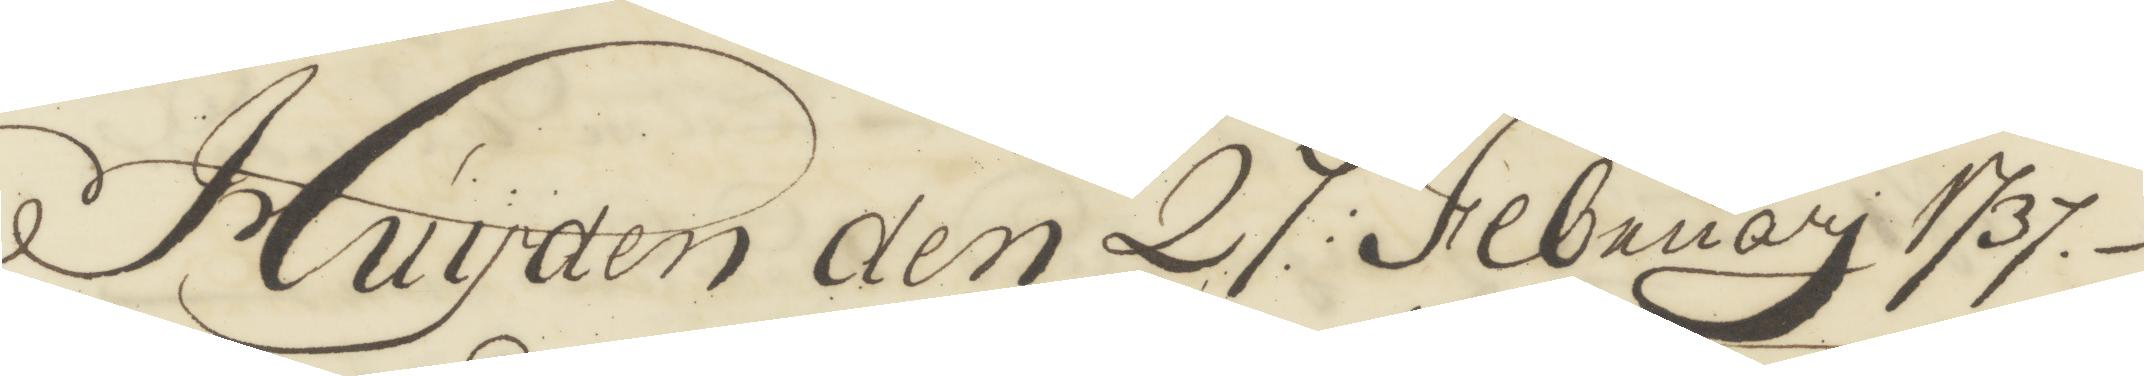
Huijden den 27:' Februarij 1737.
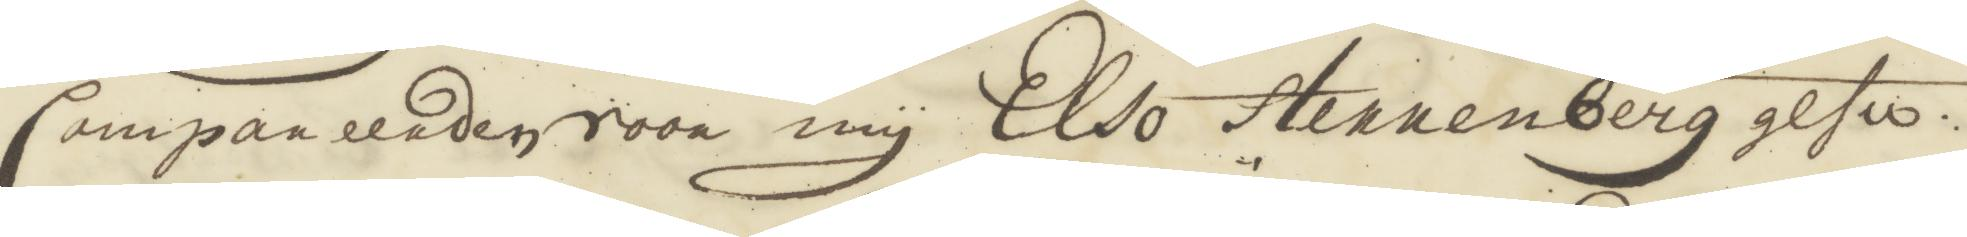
Compareerden voor mij Elso sterrenberg gesw:
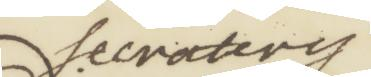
Secraterij
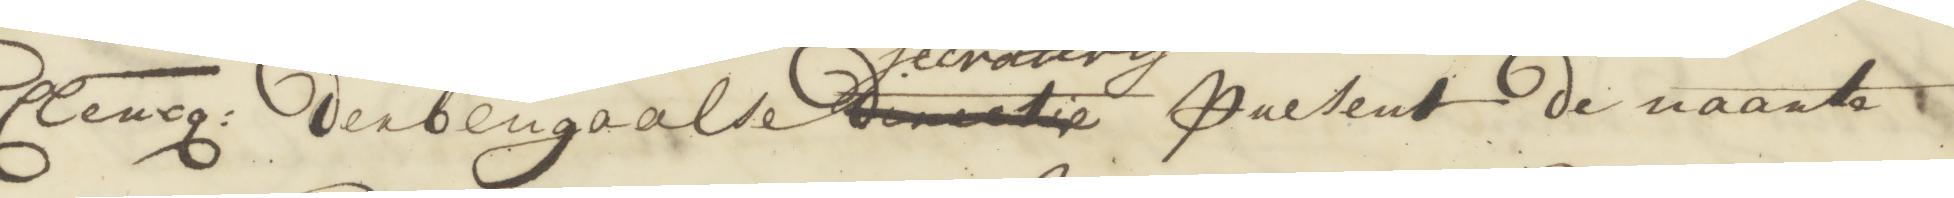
Clercq: der bengaalse directie present de naarte
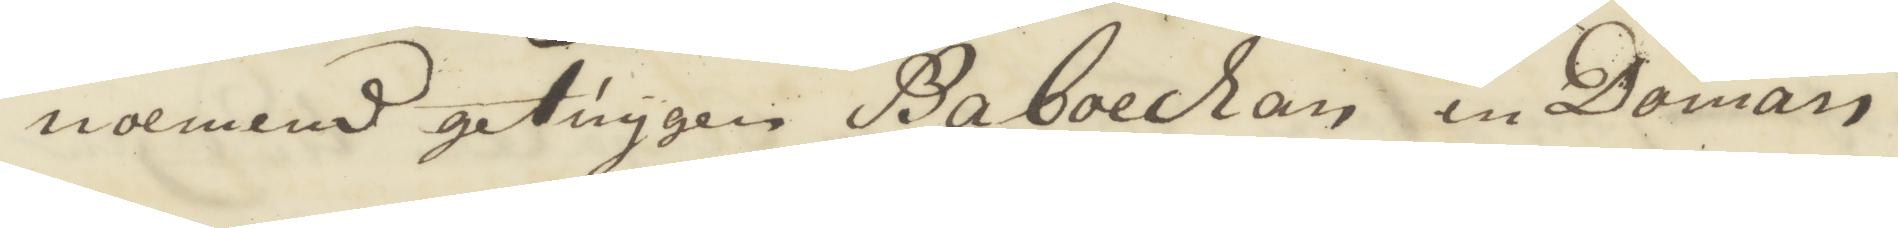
noemene getuijgen Baboechan en Doman
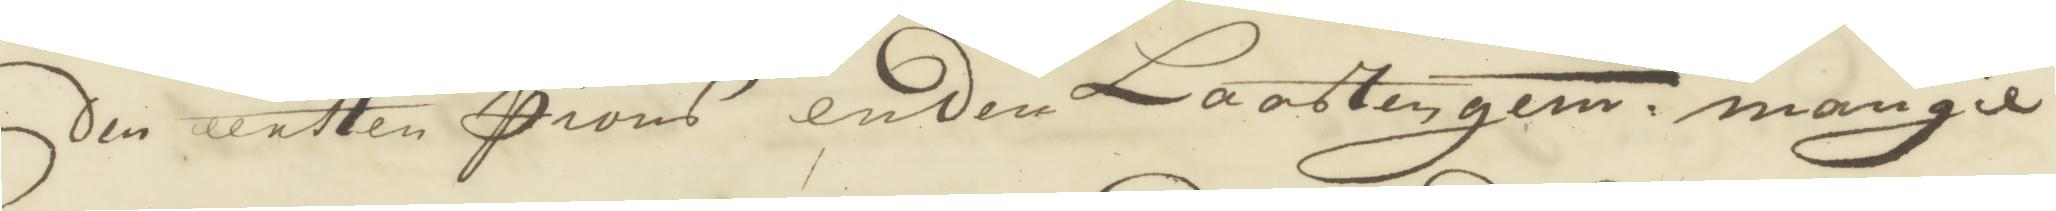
den eersten pions en den Laasten gem: mangie
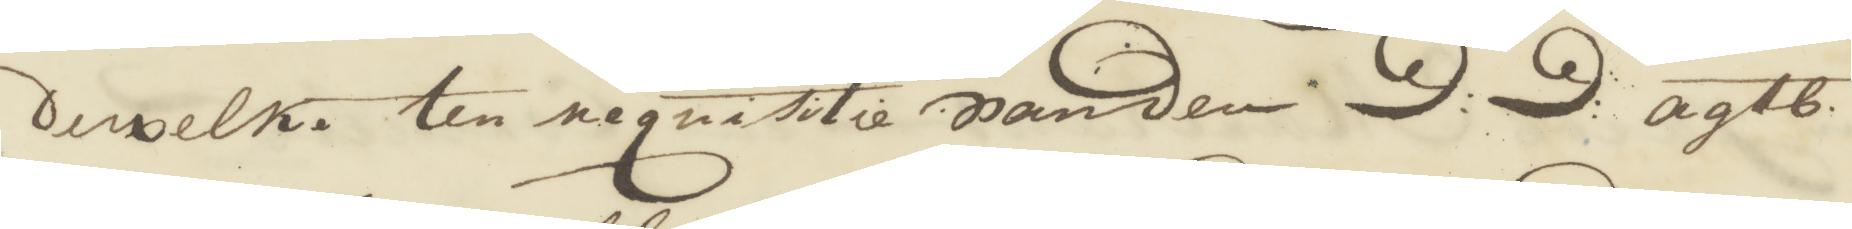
dewelke ten requisitie van den E: E: agtb:
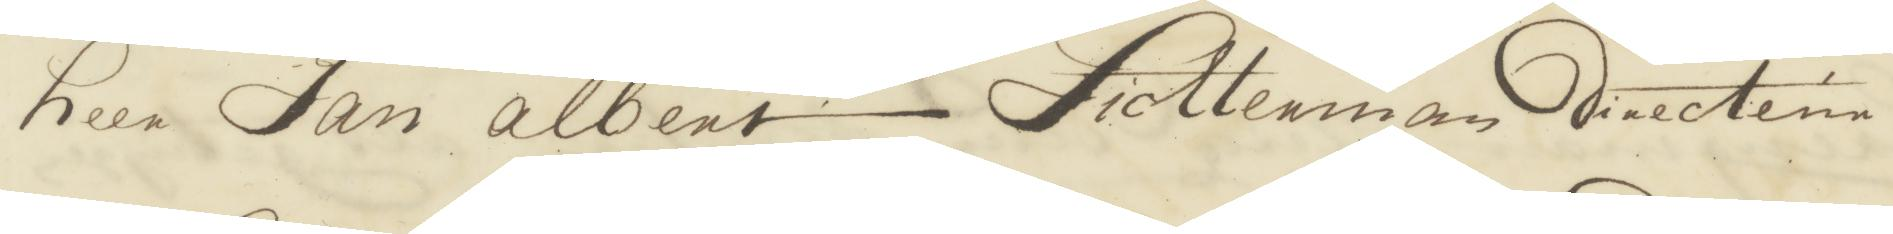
heer Jan albert Sichterman directeur
